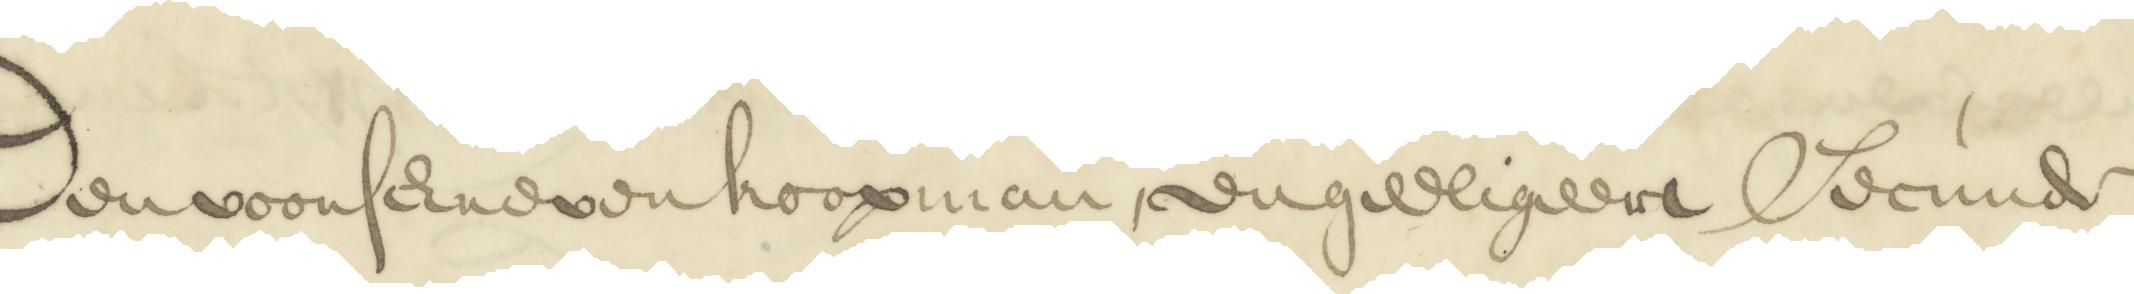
Den voorschreven koopman, en geeligeert Secunde
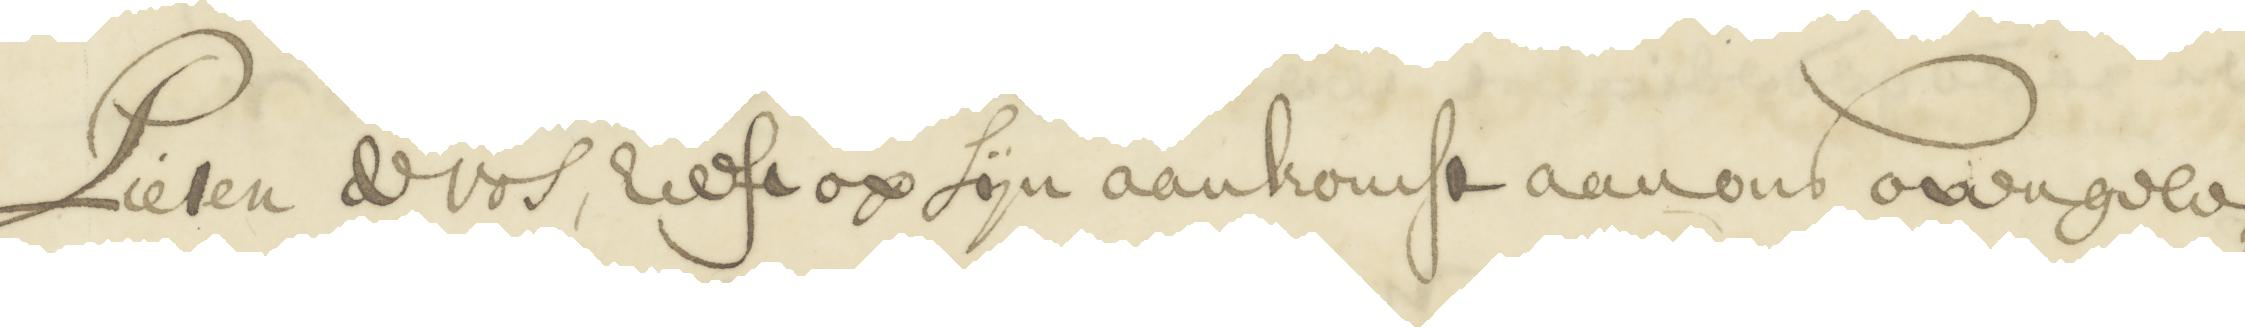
Pieter de vos, heeft op sijn aankomst aan ons over gele„
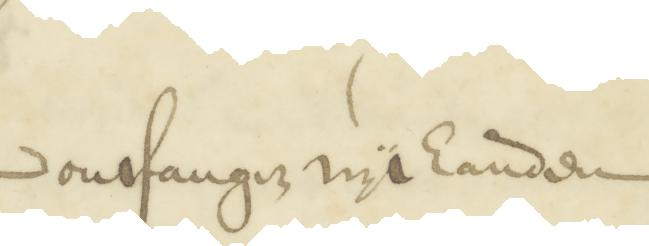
ontfangen uijt handen
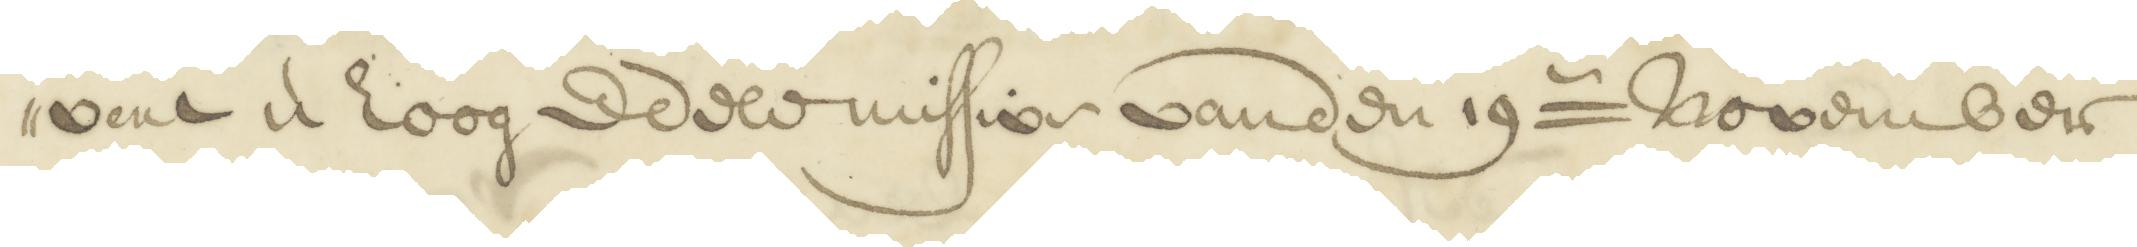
„vert u hoog Edele missive van den 19=en november
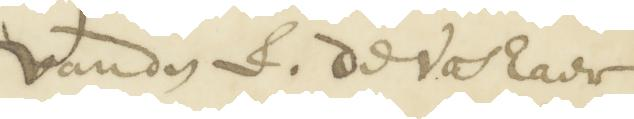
van den E. de Vos haer
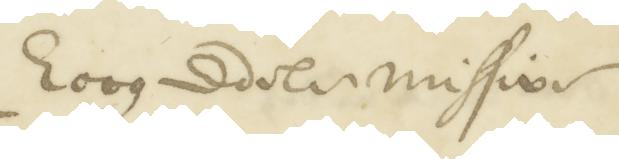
hoog Edele missive
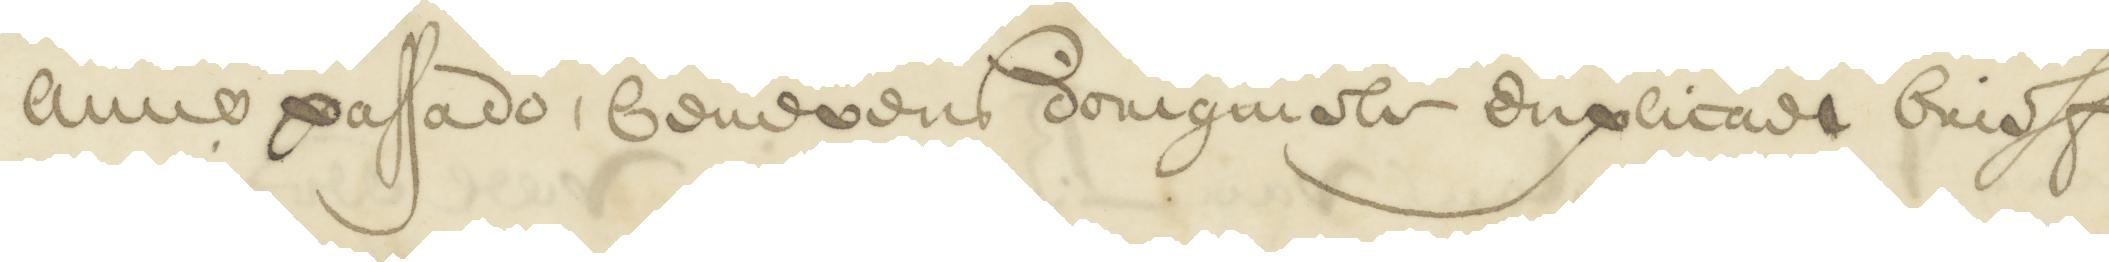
Anno passado, benevens d'originele duplicaet brief
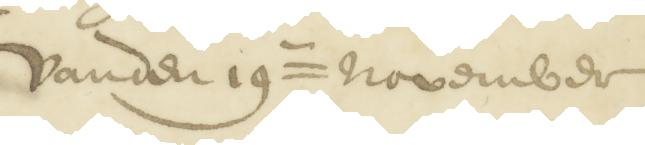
vanden 19=e november
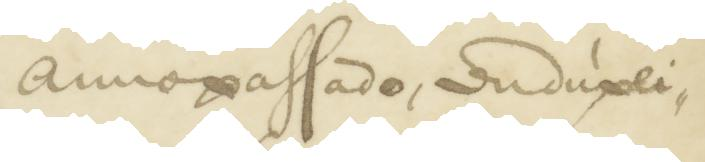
Anno passado, en dupli„
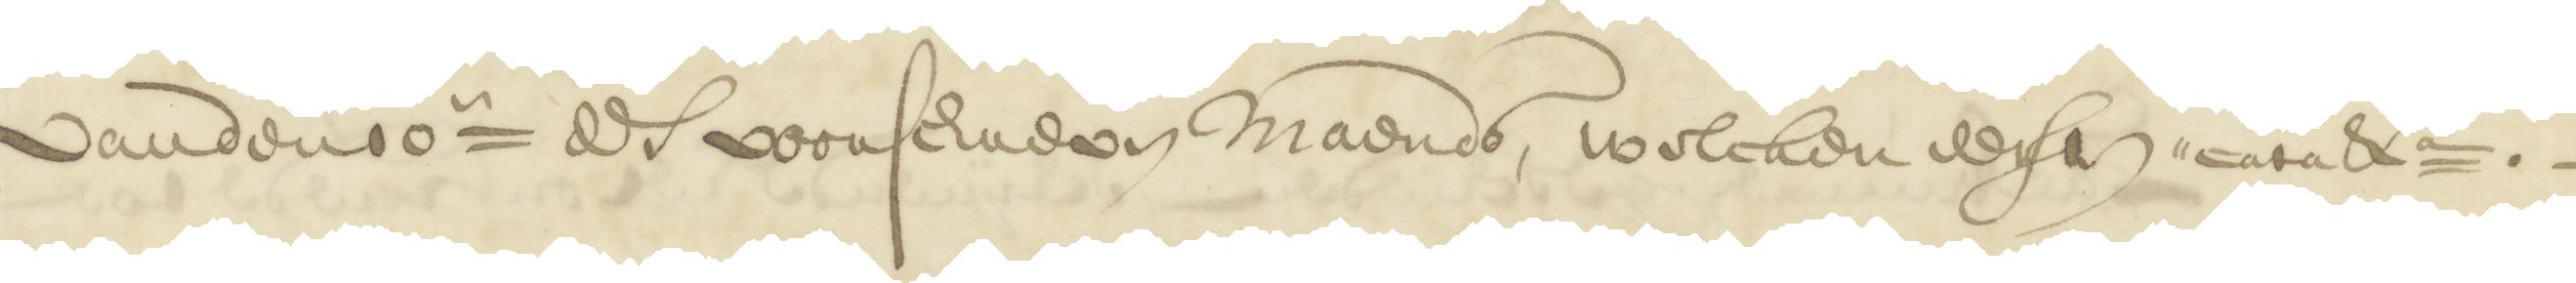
van den 10=e des voorschreven maends, welcken eerst „cata &=a.
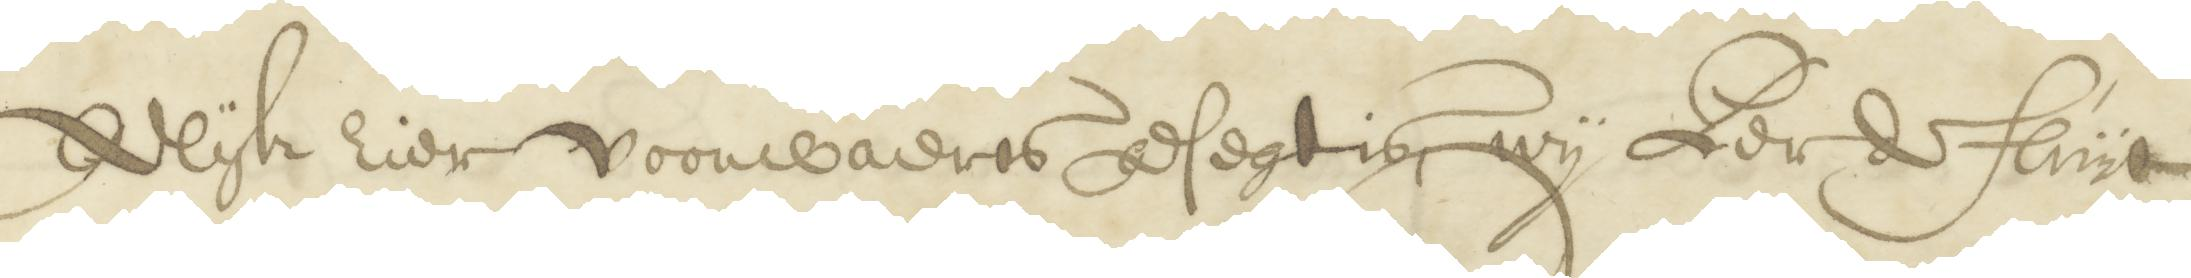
Elijk hier voorwaerts gesegt is, wij Per de fluijt
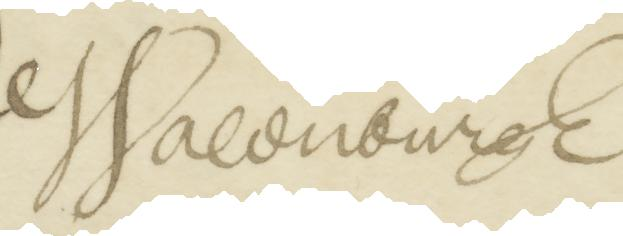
Walenburgh
